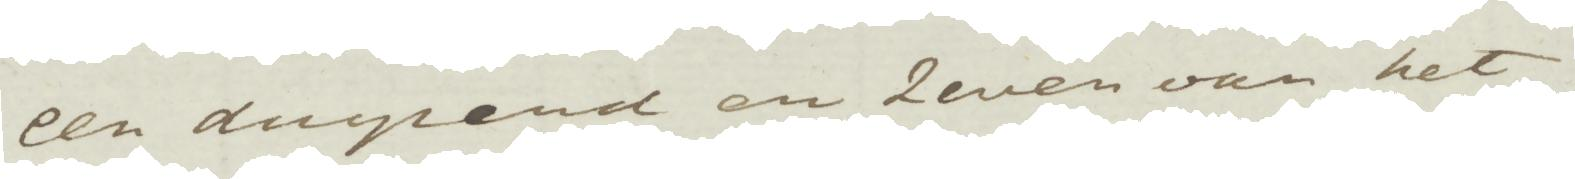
een duyzend en zeven van het
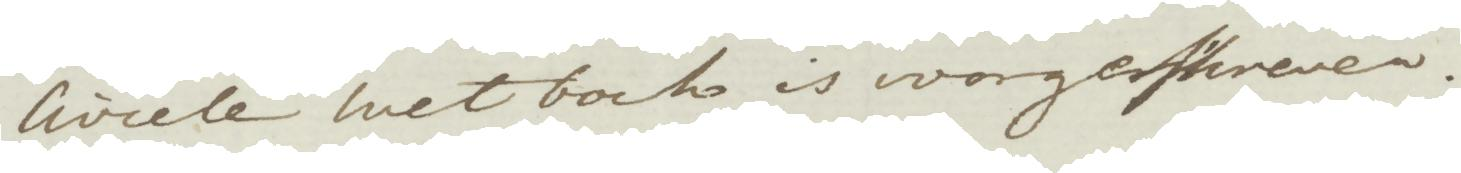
civiele wetboek is voorgeschreven.
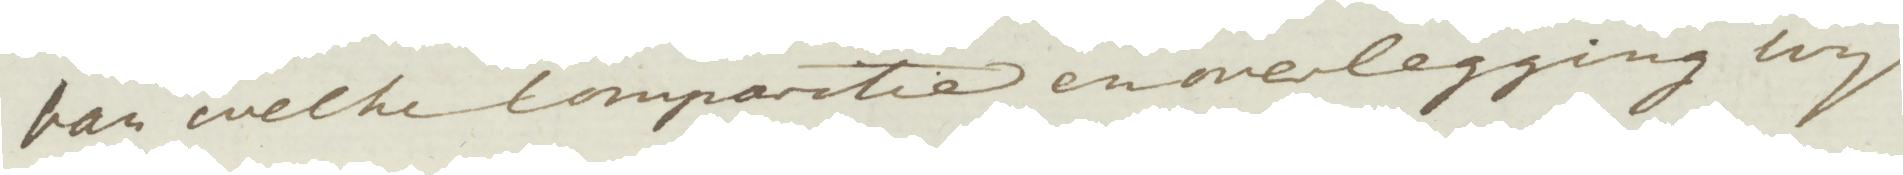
van welke comparitie en overlegging wy
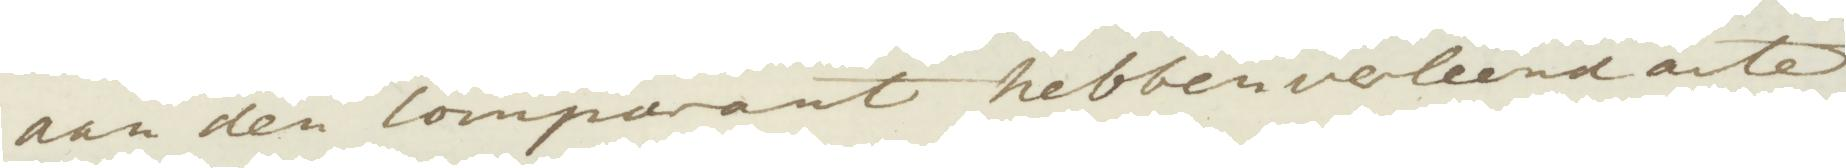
aan den Comparant hebben verleend ante
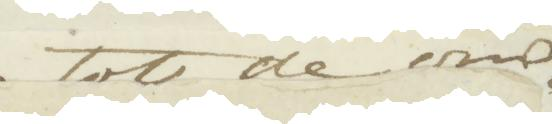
tot de
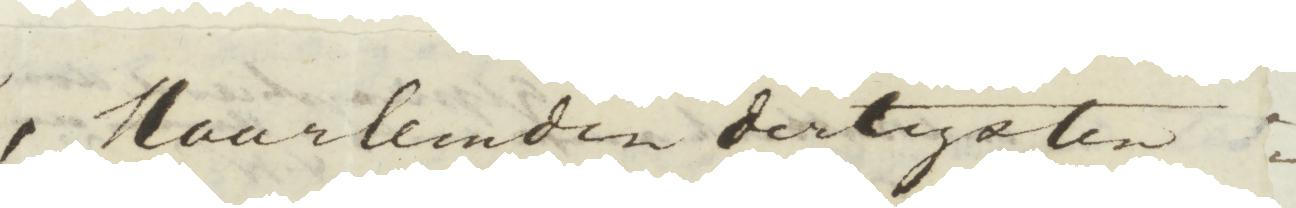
Haarlemden dertigsten
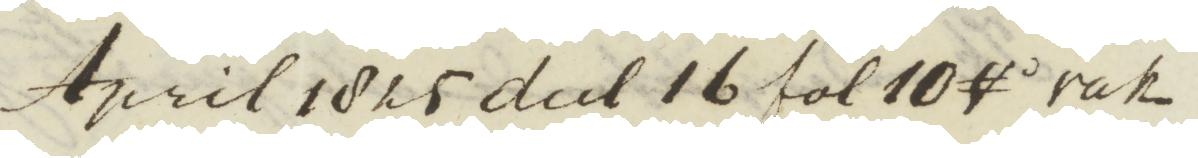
April 1825 deel 16 fol 10V=o vak
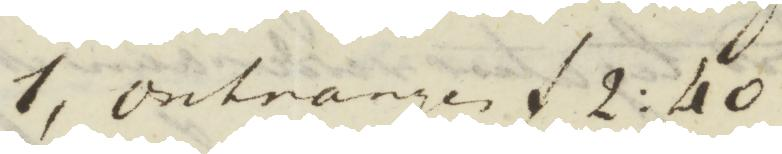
1, ontvangen ƒ 2: 40
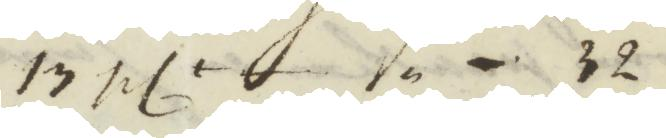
13 pCt — „ —. 32
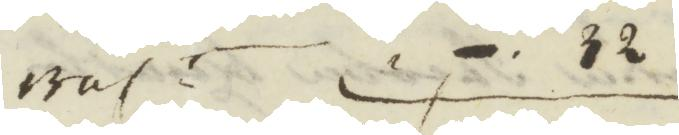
12 pCt „ —. 32
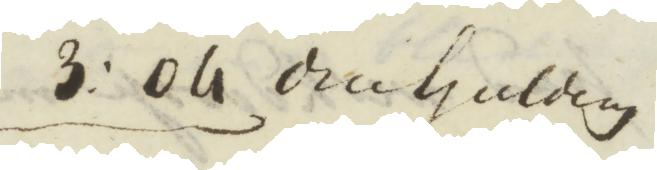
ƒ 3: 04 drie Guldens
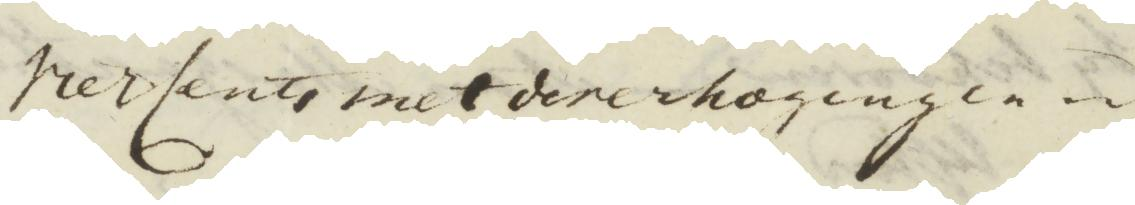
vier Cents met deverhogingen
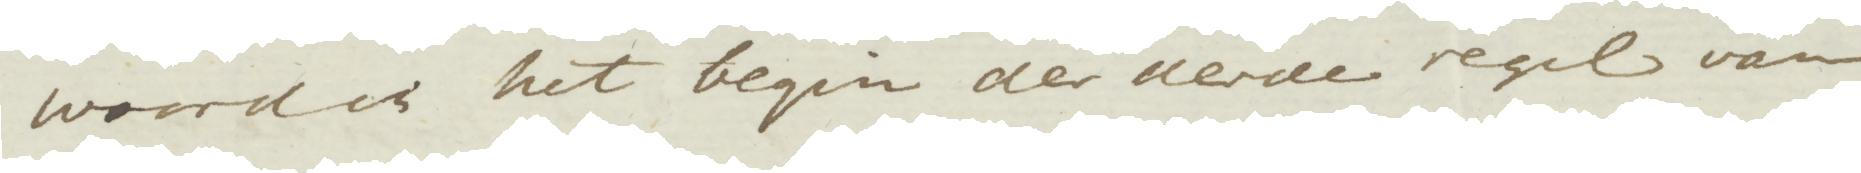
woord is het begin der derde regel van
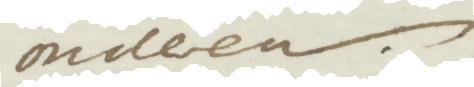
onderen.
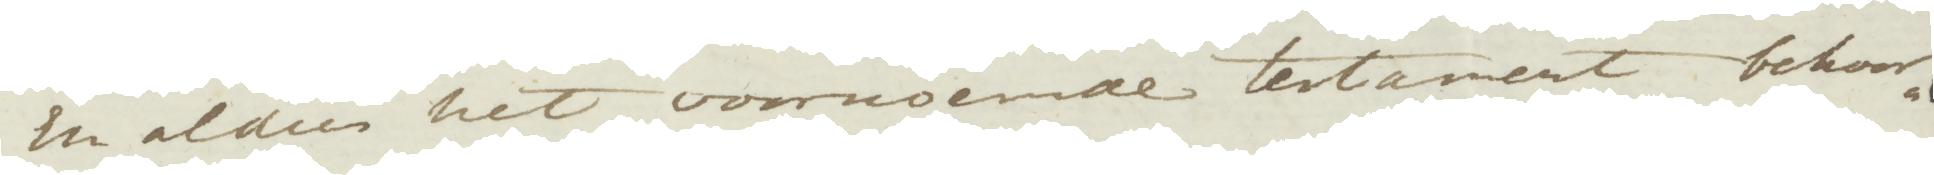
En aldus het voornoemde testament behoor„
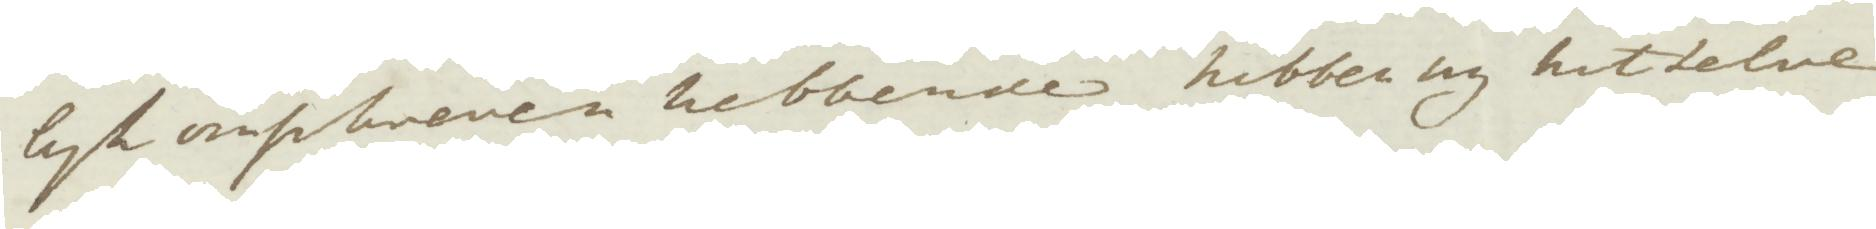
lyk omschreven hebbende, hebben wy hetzelve
